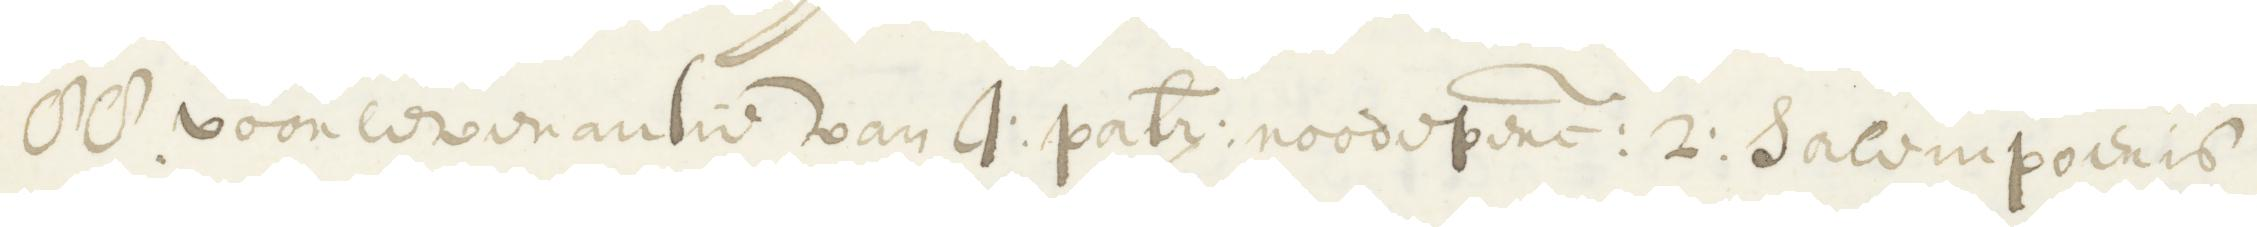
88. voor leverantie van 4: pak: roodeperc: 2: salempoeris
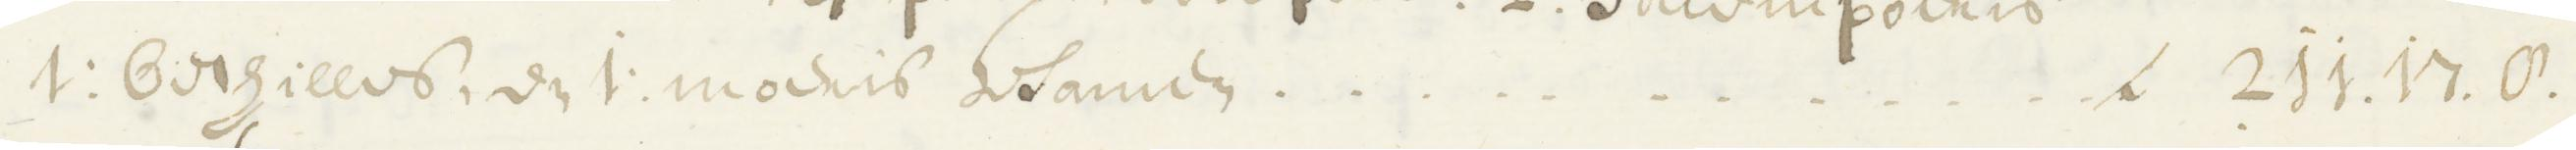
1: bethilles, en 1: moeris tesamen - - - - - - - - - - - ƒ 211.17. 8.
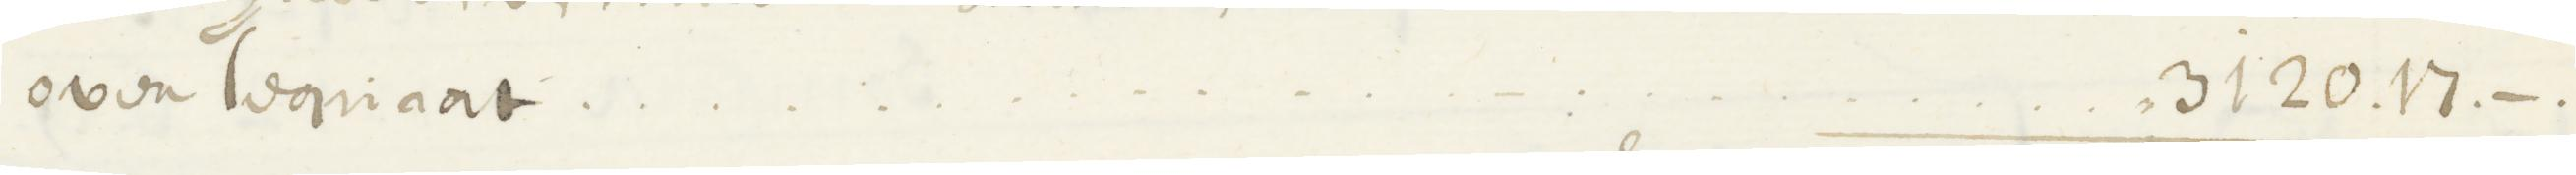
over tequaat - - - - - - - - - - - - - - - - - - - - - - - „ 3120.17. —.
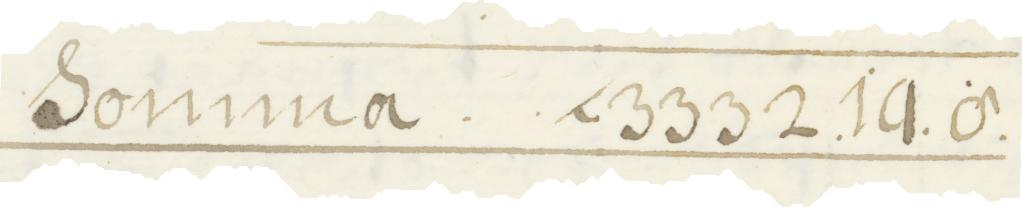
Somma - - ƒ 3332.14. 8.
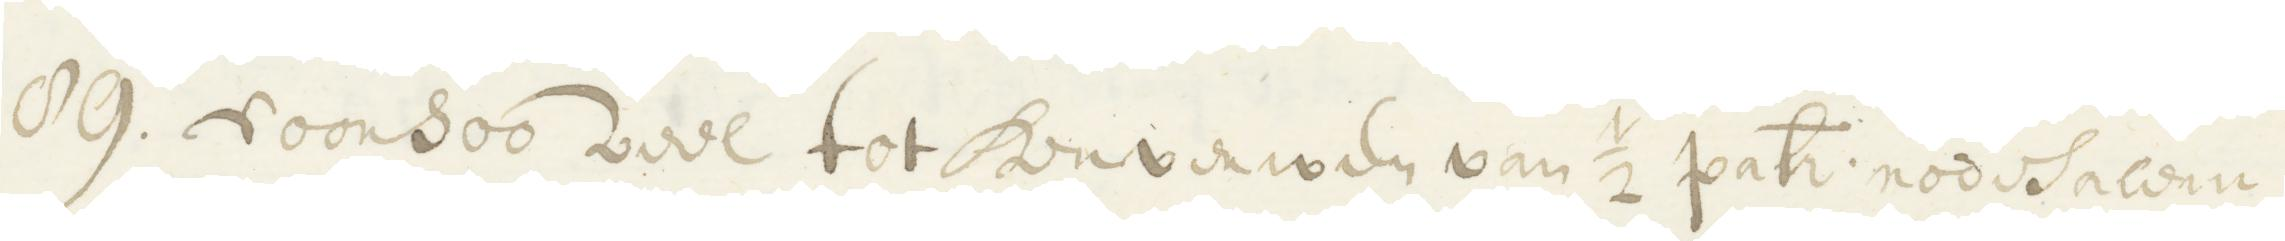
89. voorsoo veel tot herverwen van ½ pak: rodesalem
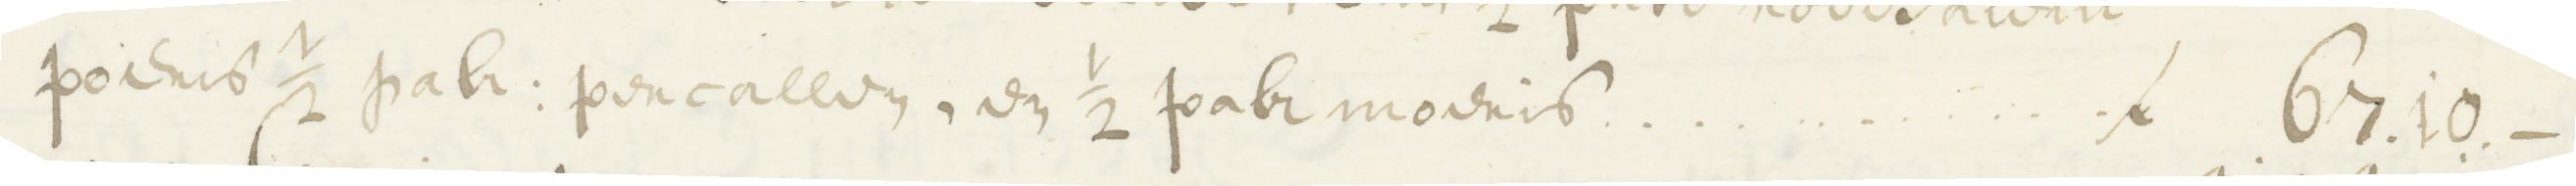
poeris 1/2 pak: percallen, en ½ pak moeris - - - - - - - - ƒ 67.10. —
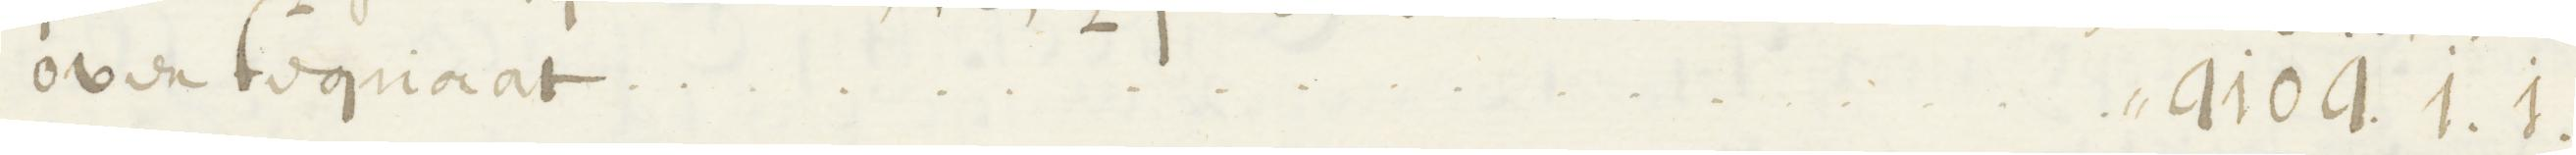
over tequaat - - - - - - - - - - - - - - - - - „ 4104. 1. 1.
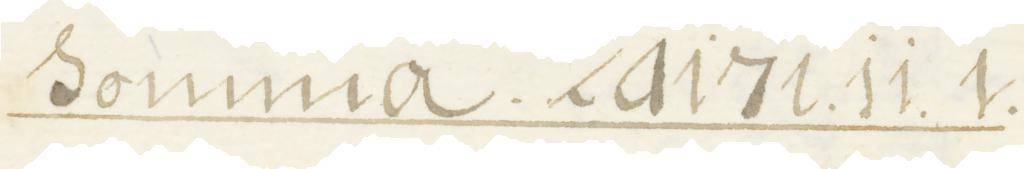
Somma ƒ 4171.11. 1.
